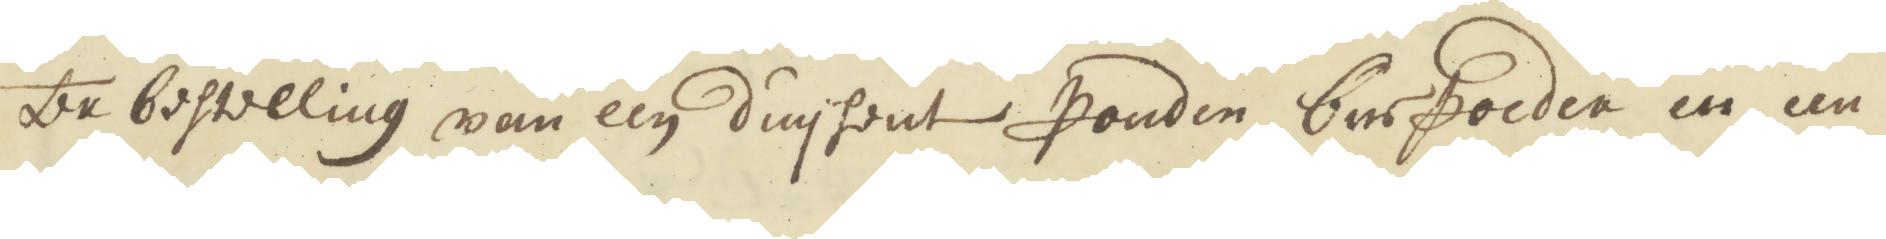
ter bestelling van een duijsent ponden buspoeder en een
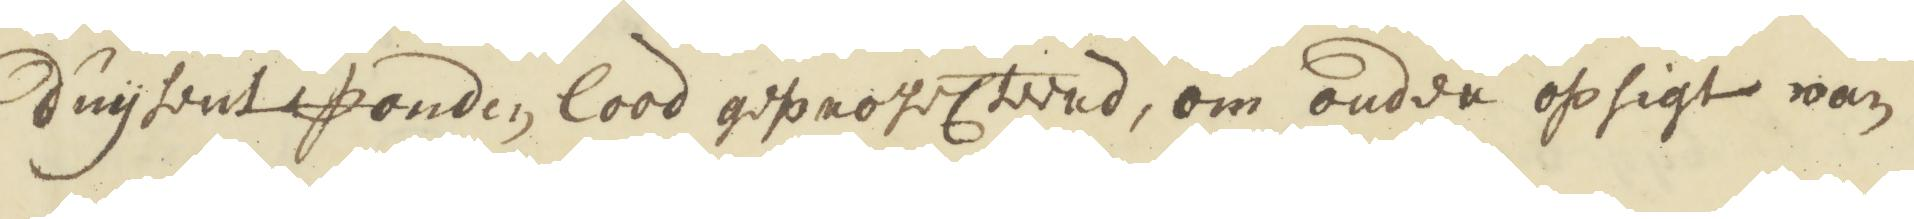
duijsent ponden lood geprojecteerd, om onder opsigt van
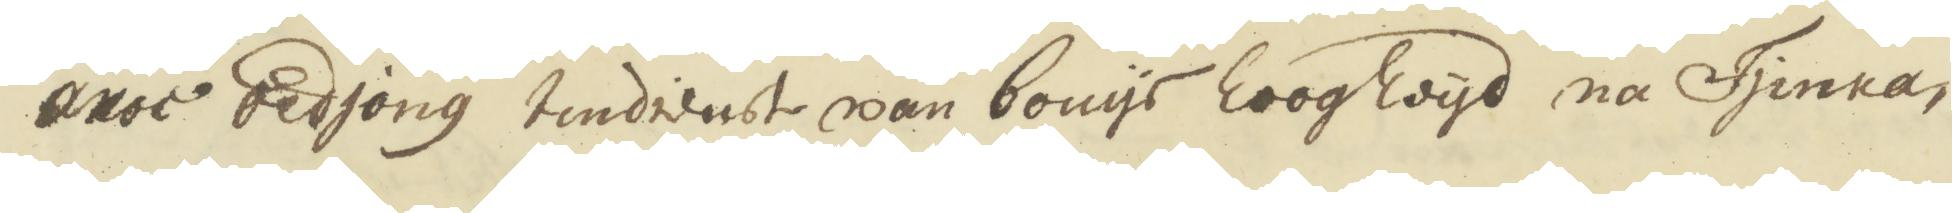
aroc oedjong tendienst van bonijs hoogheijd na Tjinra„
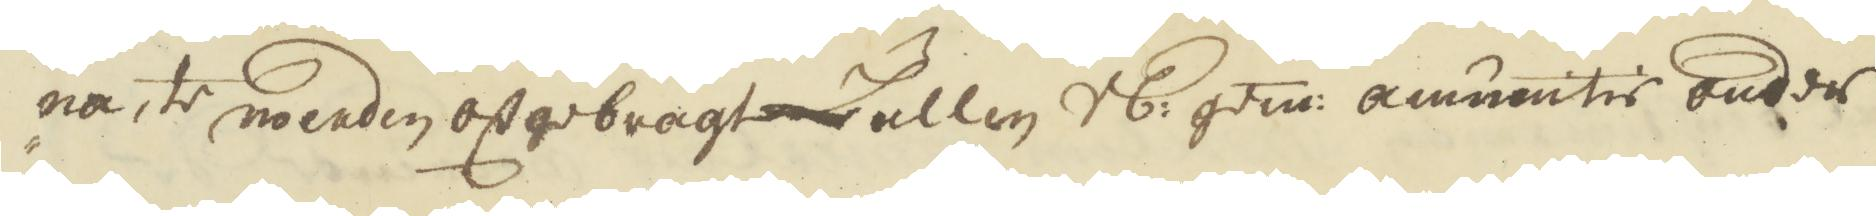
„na, te werden overgebragt zullen VE: gem: amunitis onder
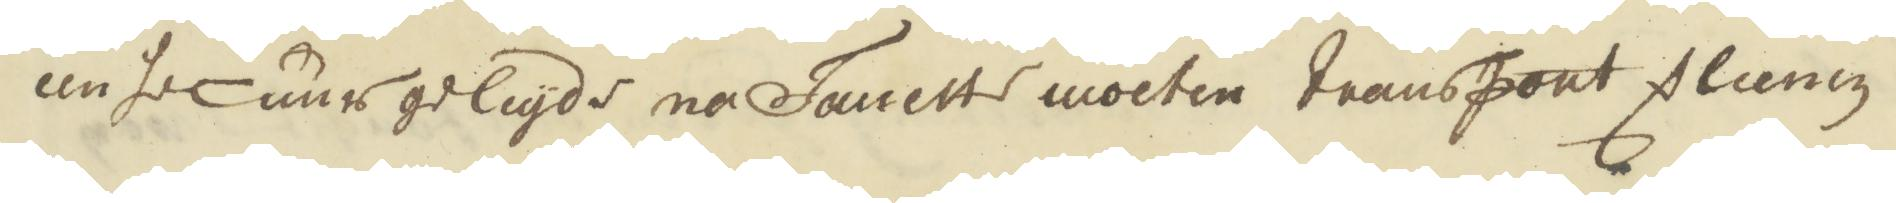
een secuur geleijde na Tanette moeten transport verleenen
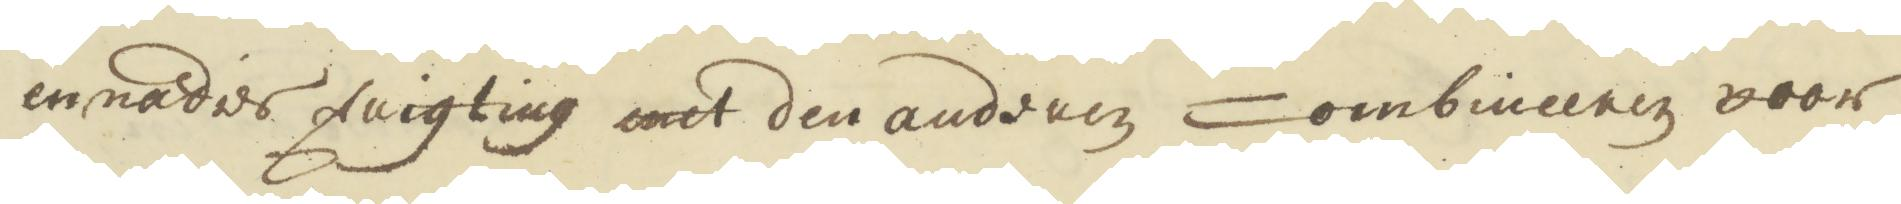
en nadies verrigting met den anderen combineeren voor
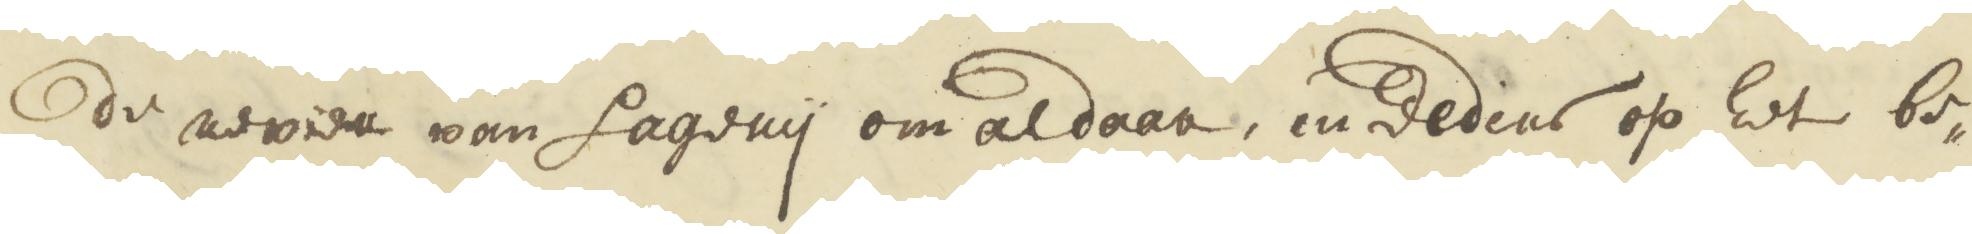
de revier van sagerij om aldaar, en Elders op het be„
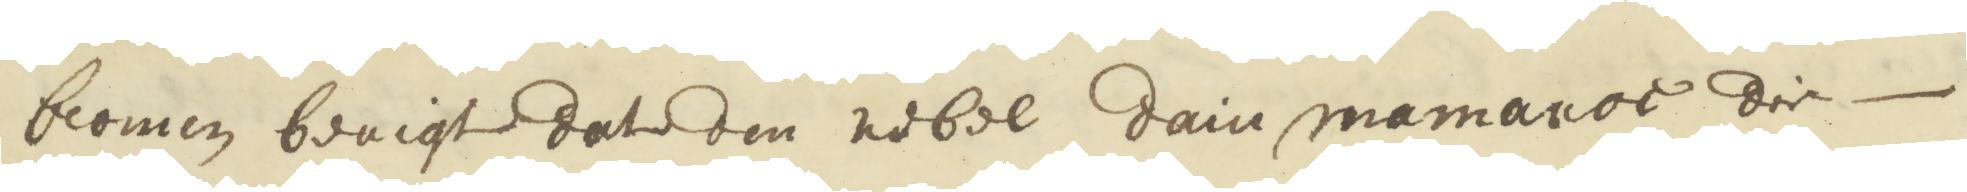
komen berigt dat den rebel dain mamaroe die —
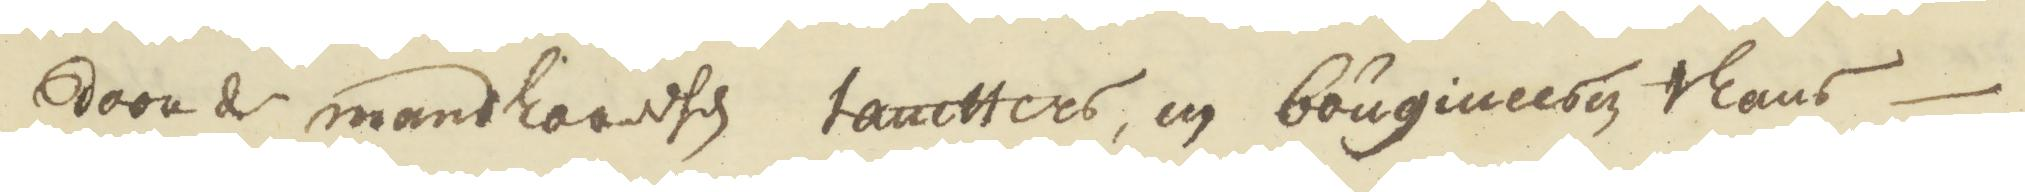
door de mandhareesen tanetters, en bougineesen thans —
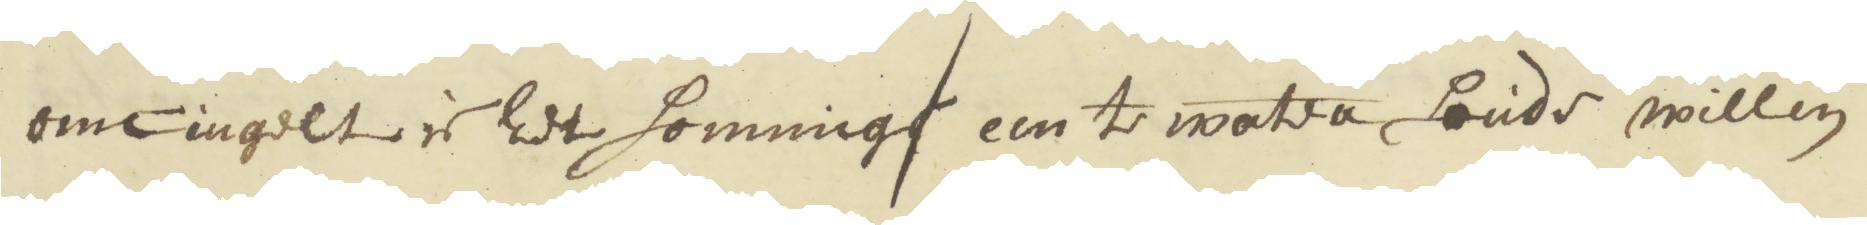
omcingelt is het sommige een te water soude willen
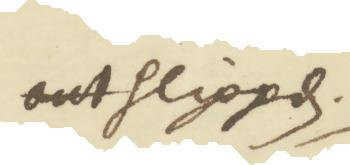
ontslippen
